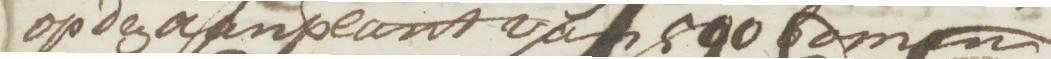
op den aanplant van 500 bomen
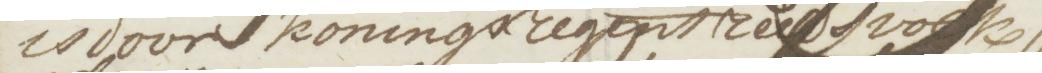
is door s konings regent reeds volk
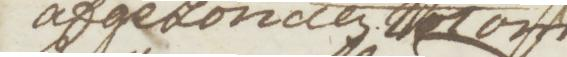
afgezonden tot om
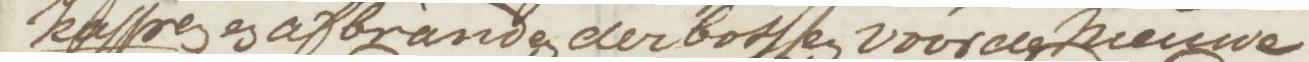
kappen en afbranden der bossen voor de nieuwe
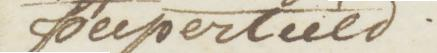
peeperteeld
